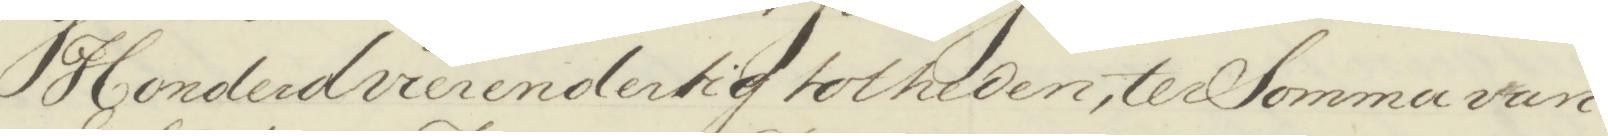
Honderd vierendertig tot heden, te somma van
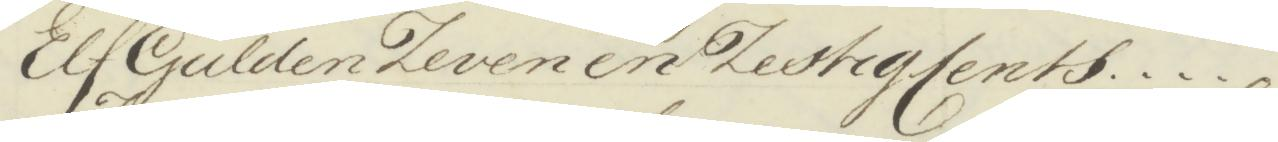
Elf Gulden Zeven en Zestig Cents
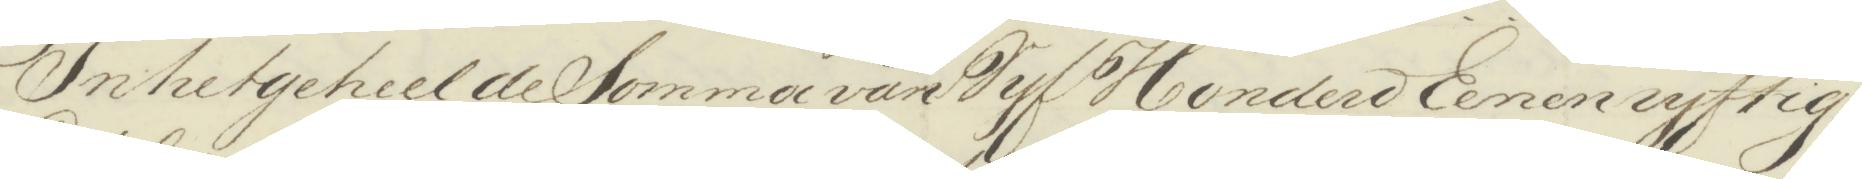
In het geheel de Somma van Vyf Honderd Eenen vyftig
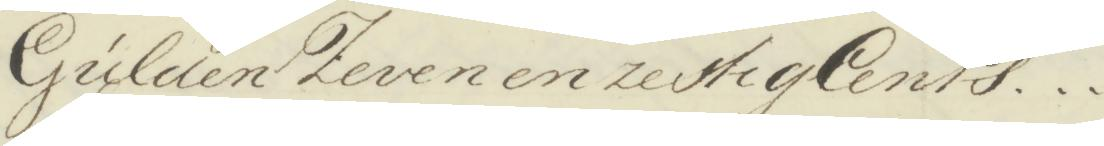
Gulden Zeven en zestig Cents.
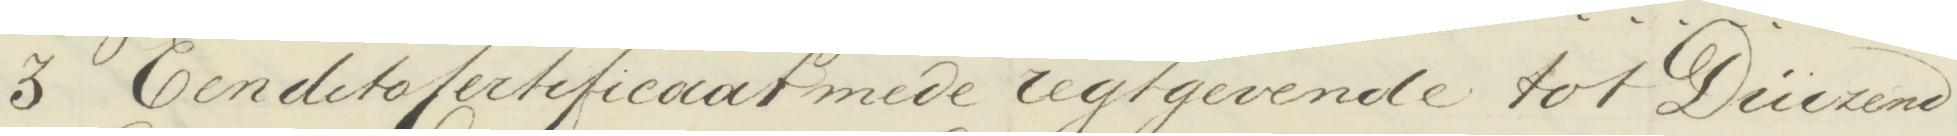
3 Een dito Certificaat mede regtgevende tot Duizend
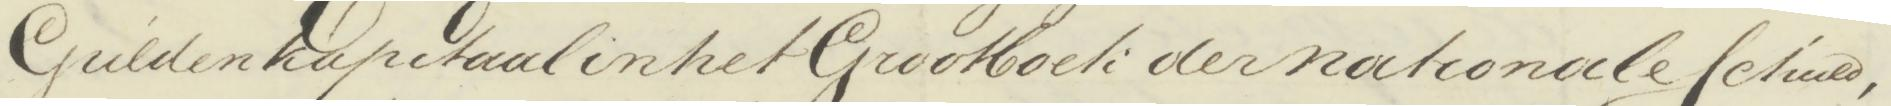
Gulden Kapitaal in het Grootboek der nationale schuld,
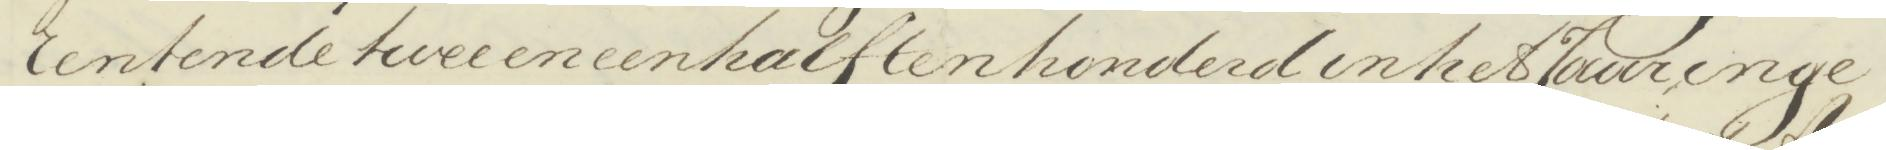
rentende twee en een half ten honderd in het Jaar inge
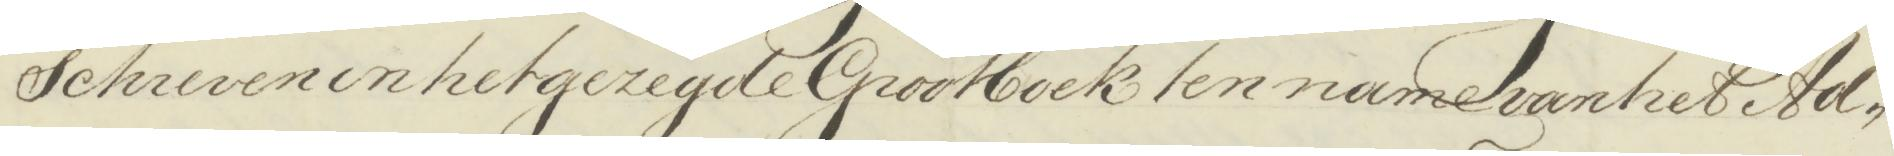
schreven in het gezegdte Grootboek ten name van het Ad„
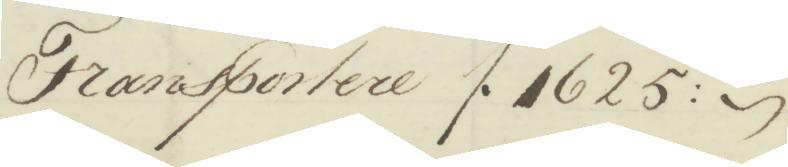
Transportere ƒ 1625:—
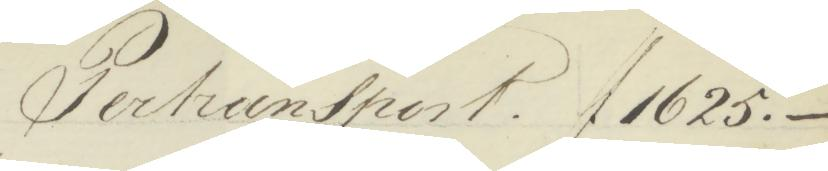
Per transport. ƒ1625.—
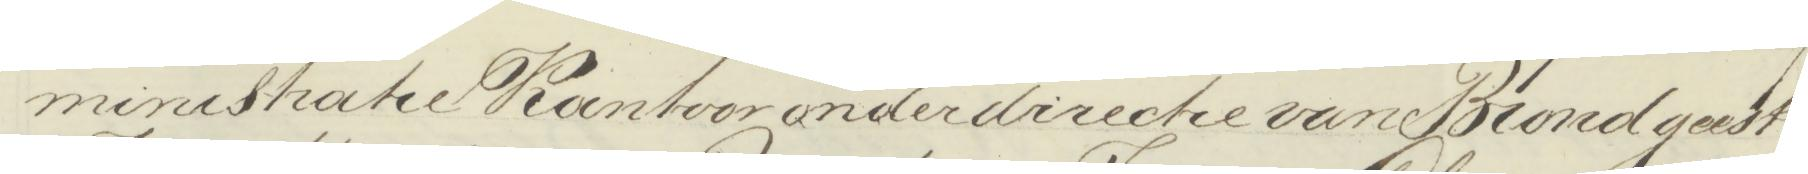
ministratie Kantoor onder directie van Brondgeest
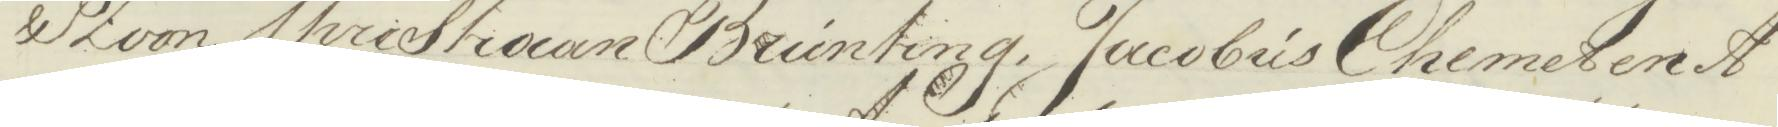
& Zoon, Christiaan Brunting, Jacobus Chemet en A
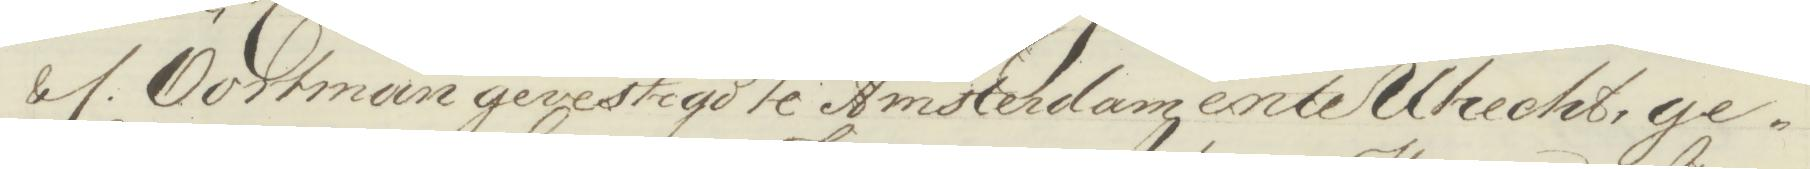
& C. Oortman gevestigd te Amsterdam en te Utrecht, ge„
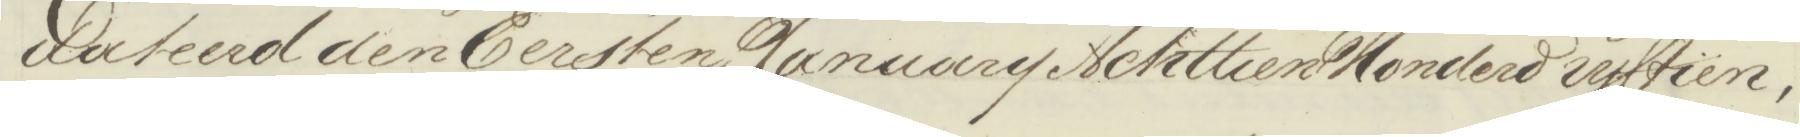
dateerd den Eersten January Achttien Honderd vyftien,
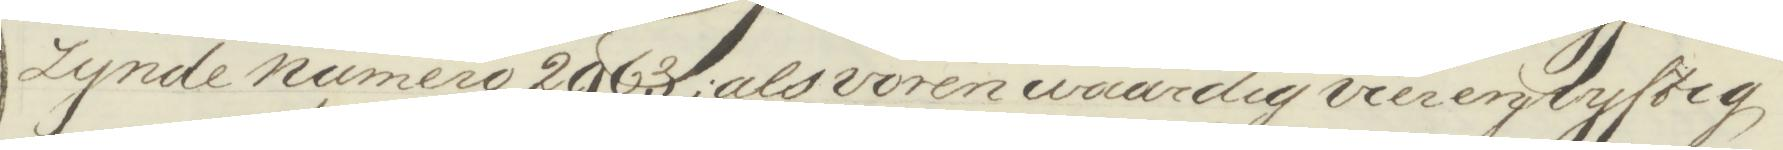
zynde numero 2963, als voren waardig viere en vyftig
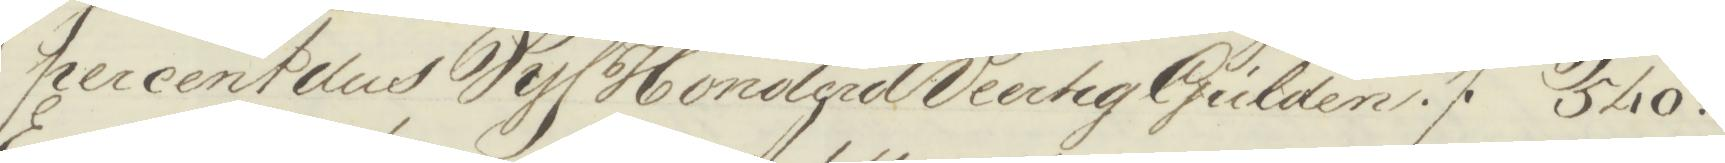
percent dus Vyf Honderd Veertig Gulden. ƒ 540:
